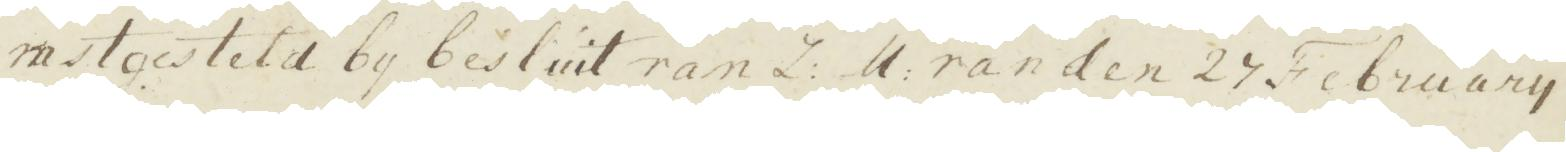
vastgesteld by besluit van Z: M: van den 27 February
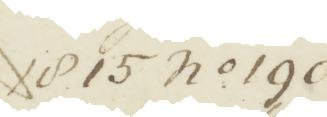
1815 n.o 190
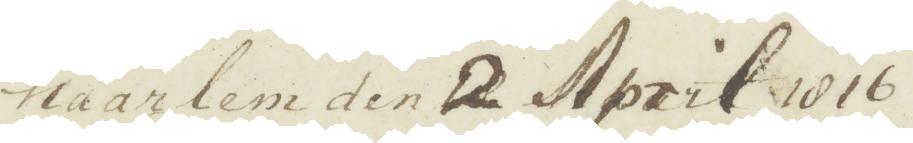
Haarlem den 2 April 1816
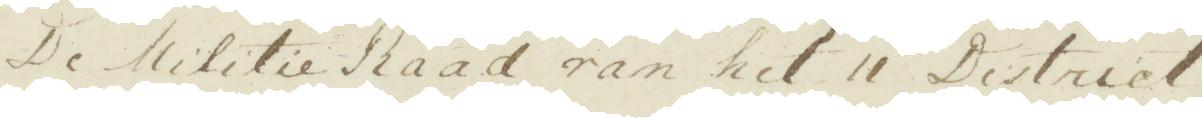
De Militie Raad van het 11 District
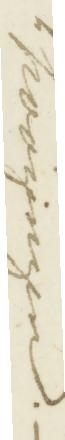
„hoogingen.
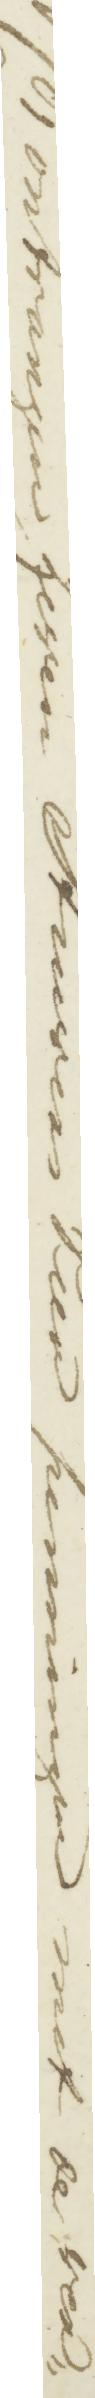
C1 ontvangen Zestien Stuivers Vier penningen met de ver„
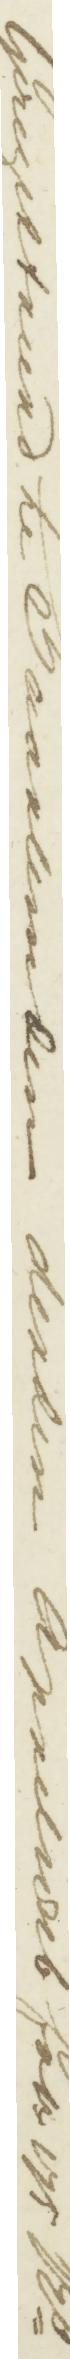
Geregistreerd te Haarlem den derden April 1816 fol.i 175 R=o
